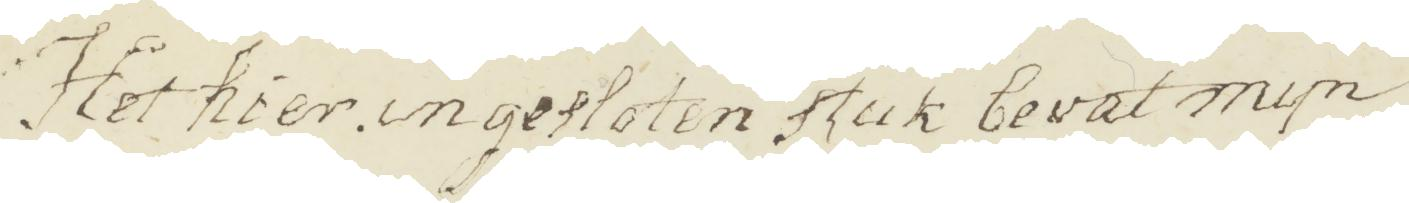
Het hier in gesloten stuk bevat myn
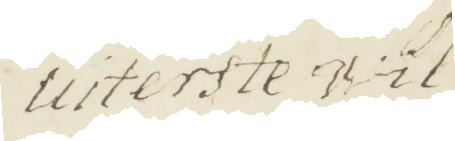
uiterste wil
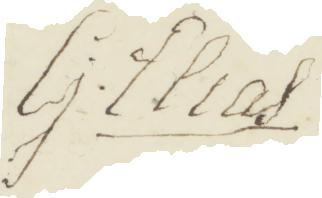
G: Elias.
